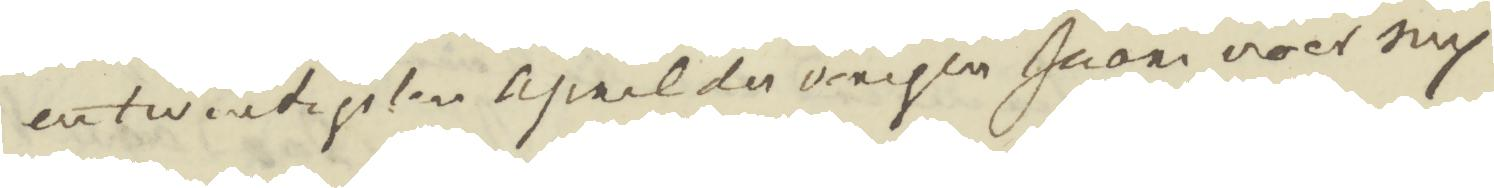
en twintigsten April des vorigen Jaars voor mij
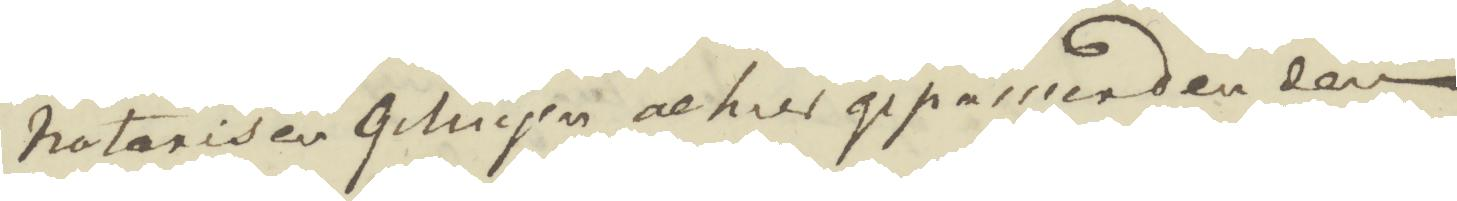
notarisen en getuigen alhier gepasseerden den
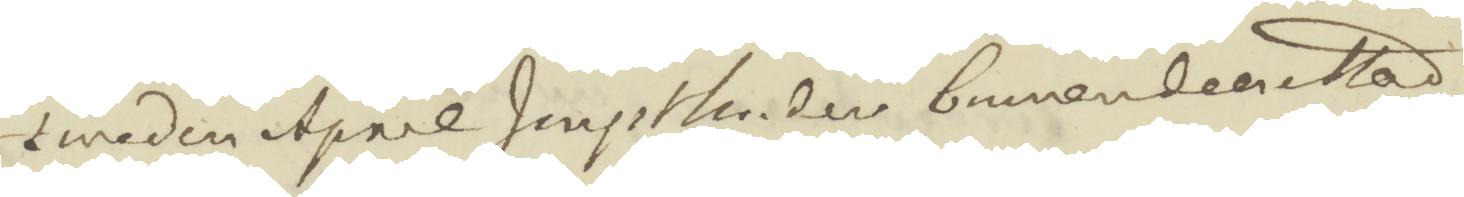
tweden April Jongstleeden binnen deese stad
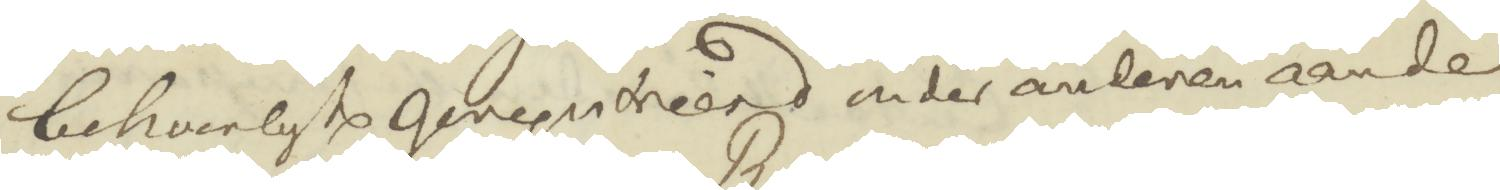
behoorlijk geregistreerd onder anderen aan de
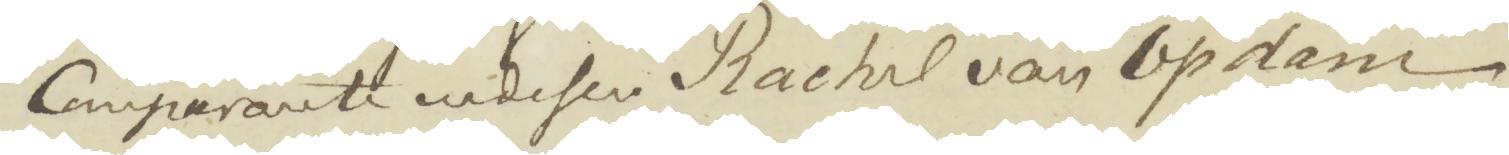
Comparante indesen Rachel van Opdam
